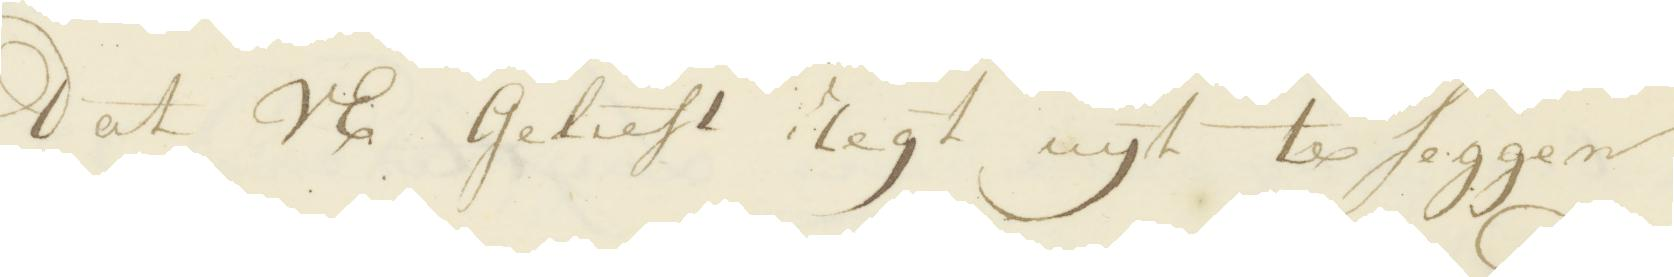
dat VE gelieft regt uijt te seggen
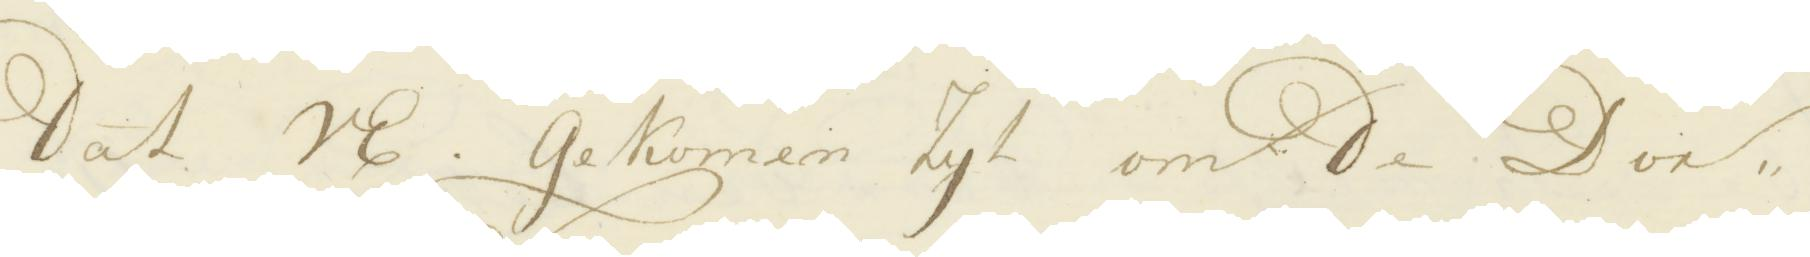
dat VE gekomen zyt om de Dor„
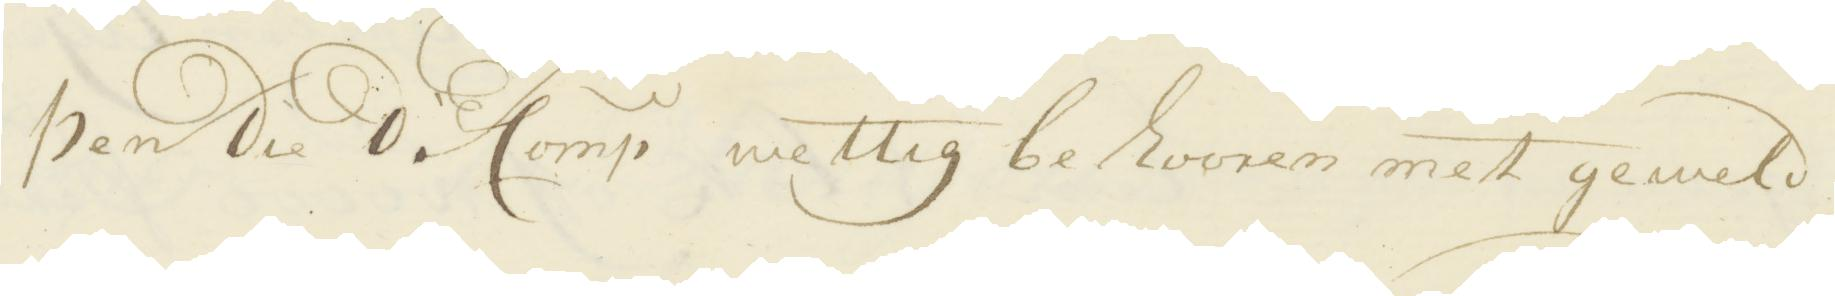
pen die d’ sComp wettig behooren met geweld
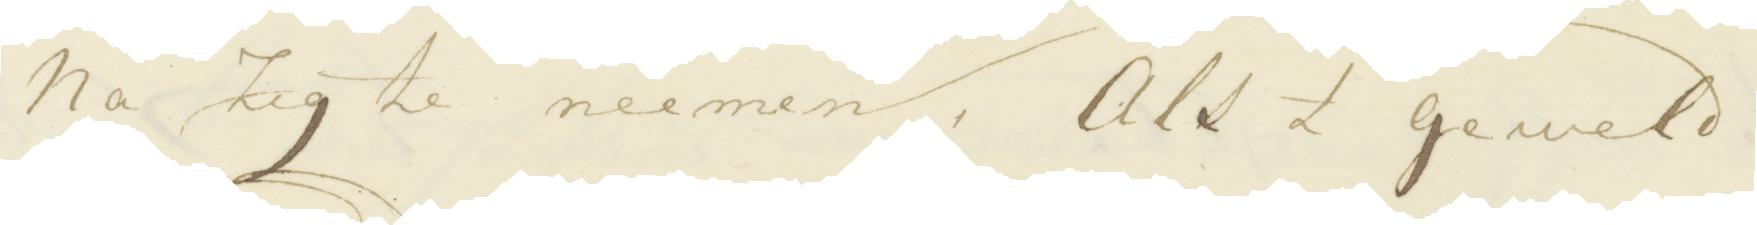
na zig te neemen, als t geweld
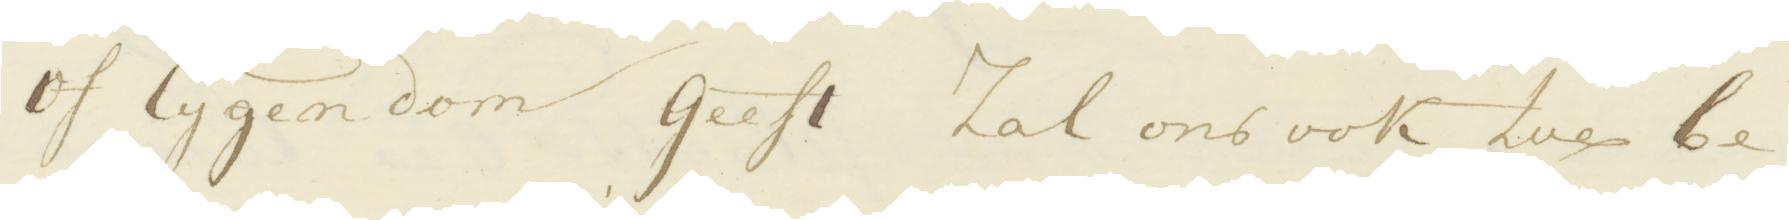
of Eygendom geeft zal ons ook toe be
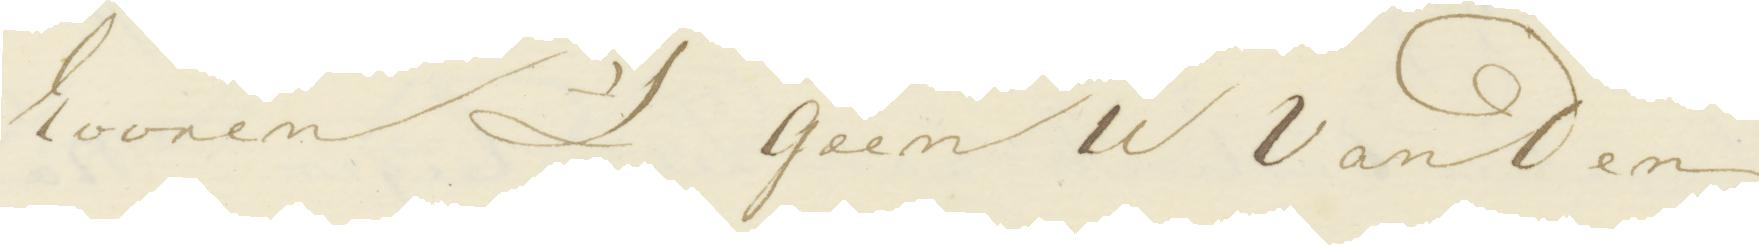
hooren 't geen u van den
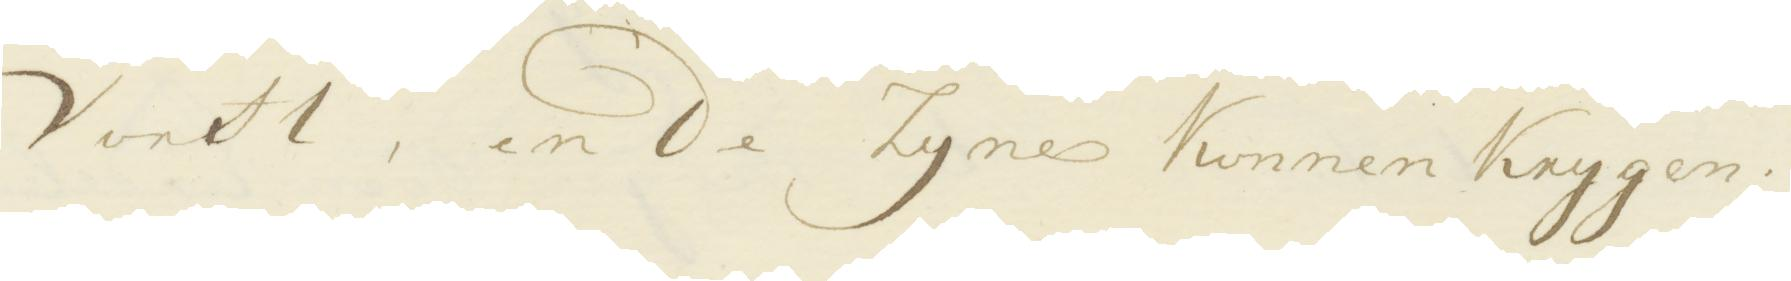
vorst, en de zyne konnen krygen.
